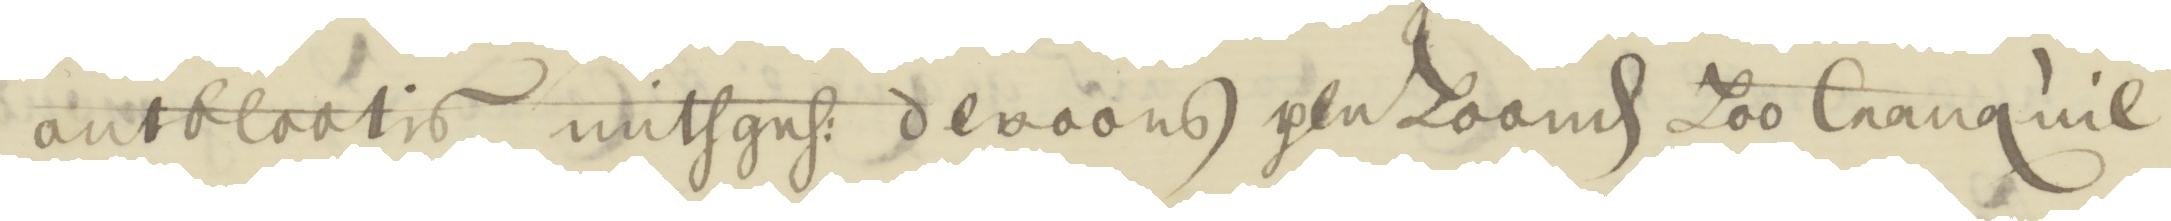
ontbloot is mitsgrs: de voors perzoonen Zoo tranquil
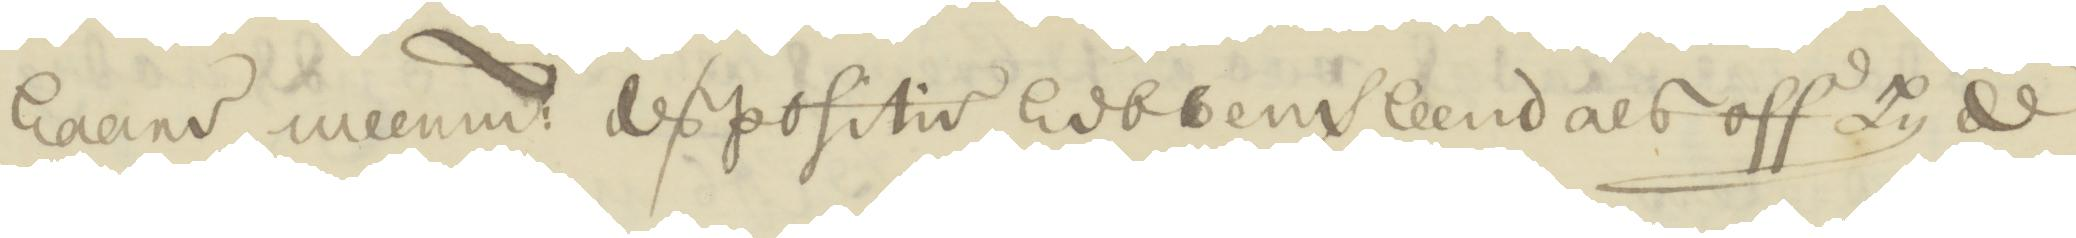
haare meerm: despositie hebben verleend als off:e Zy de
